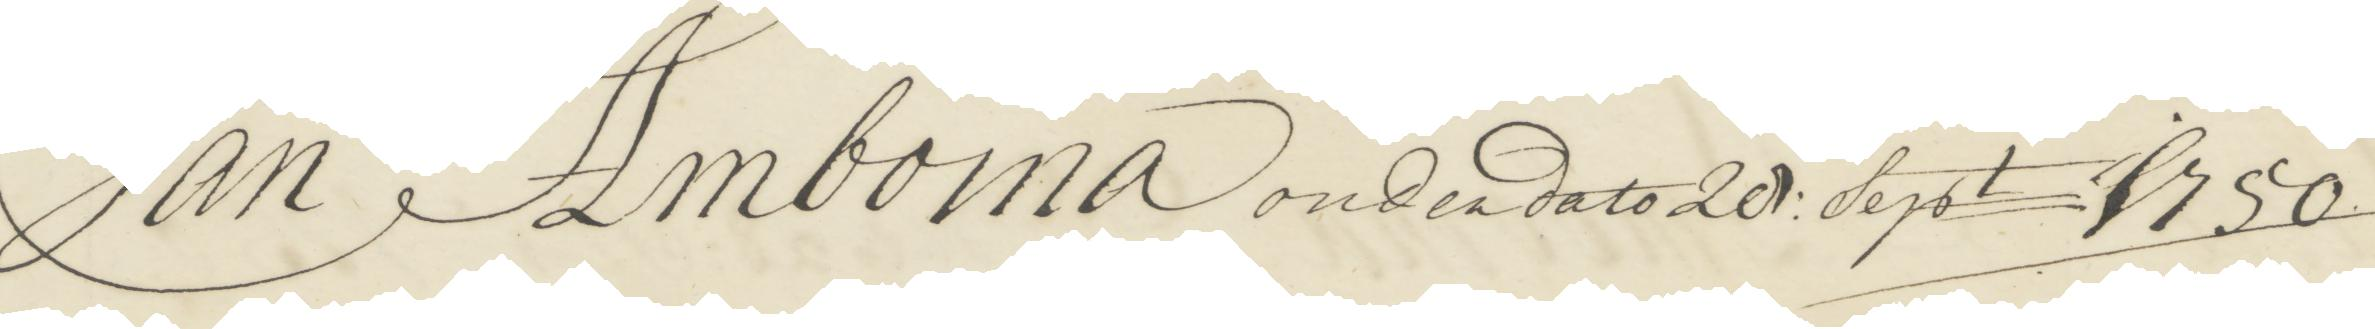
Van Amboina onder dato 28: Sep=t 1750.
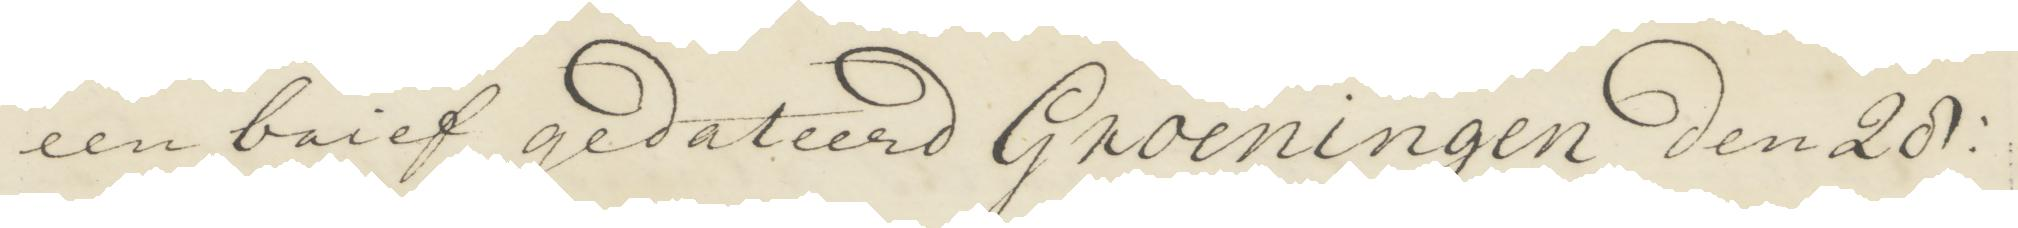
een brief gedateerd Groeningen den 28:
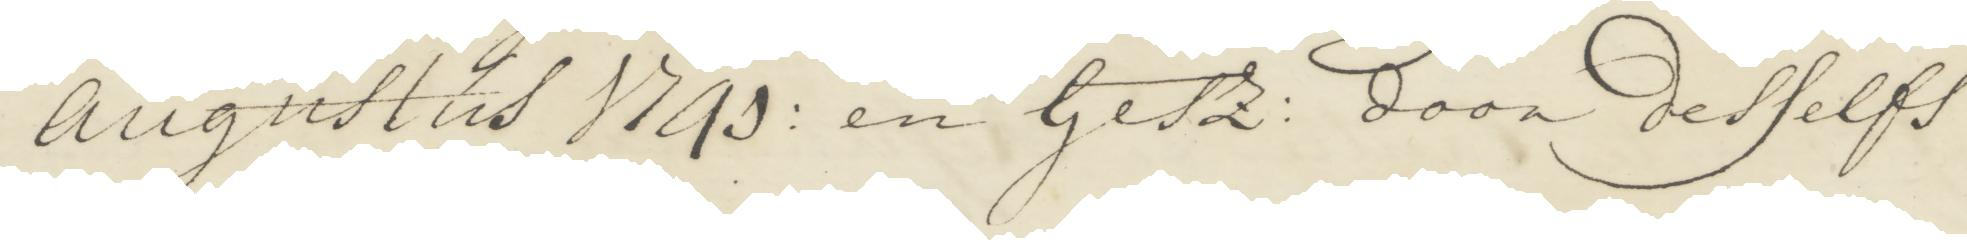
Augustus 1741: en Gesz: door desselfs
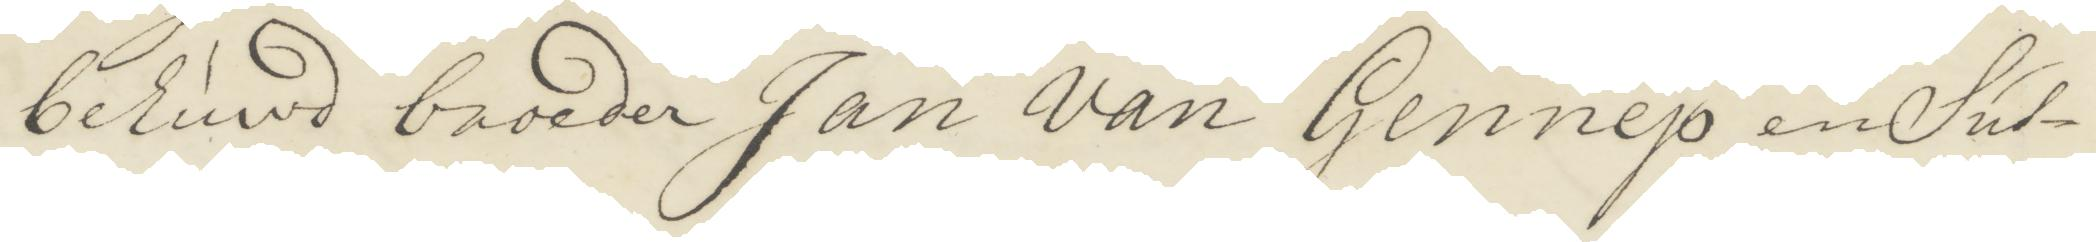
behuwd broeder Jan van Gennep en Sus-
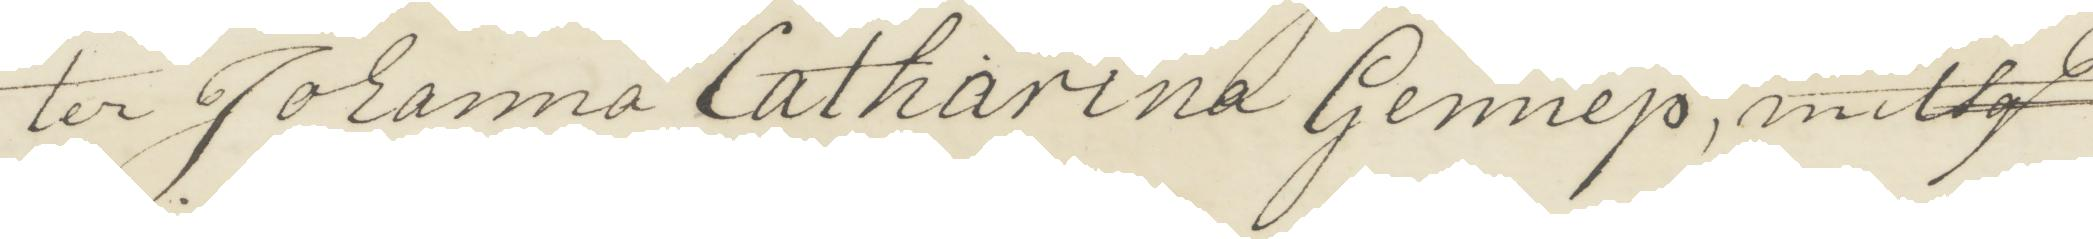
ter Johanna Catharina Gennep, mitsg=s
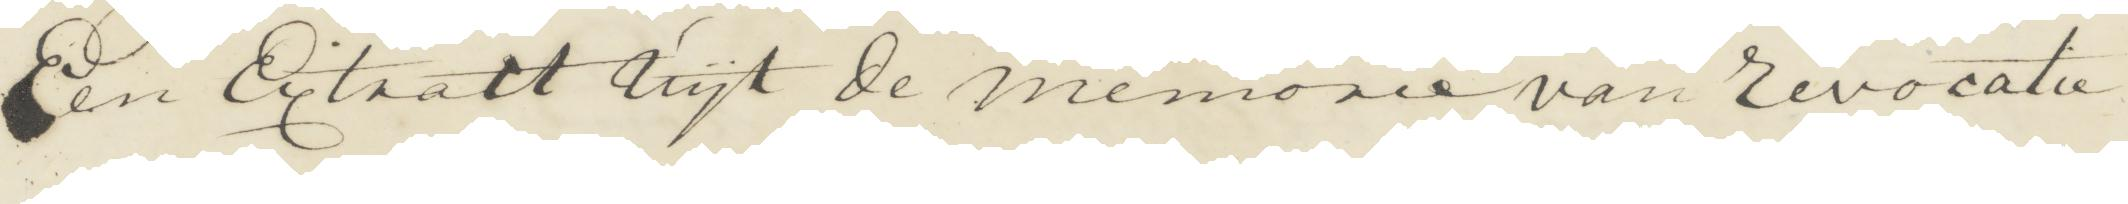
Een Extract uijt de memorie van revocatie
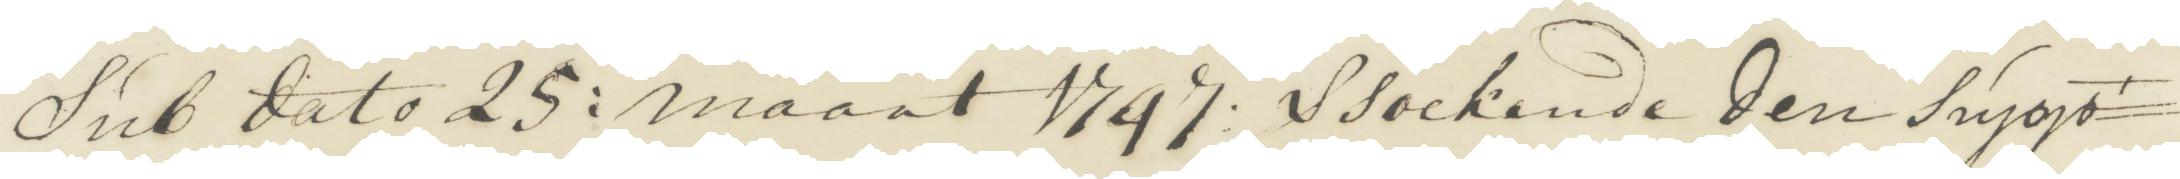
sub dato 25: maart 1747: Versoekende den supp=t
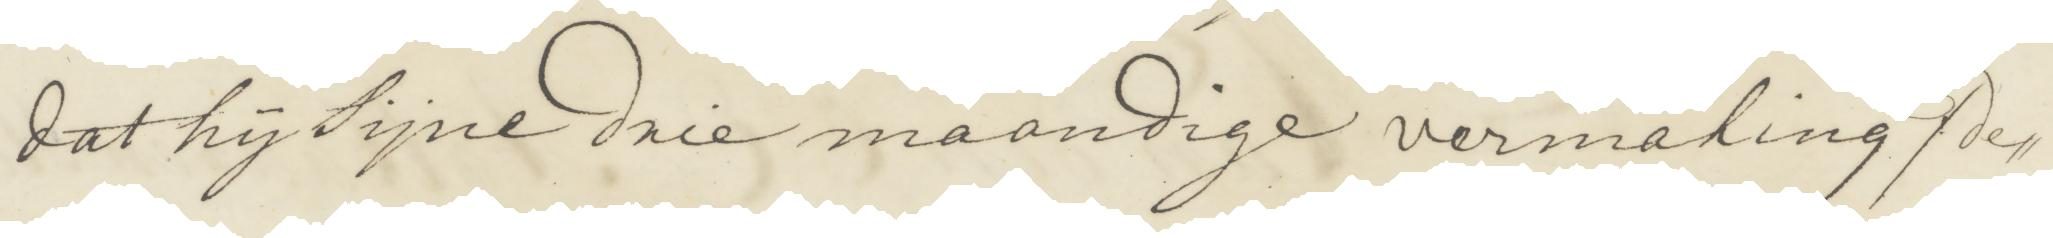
dat hij sijne drie maandige vermaking /de„
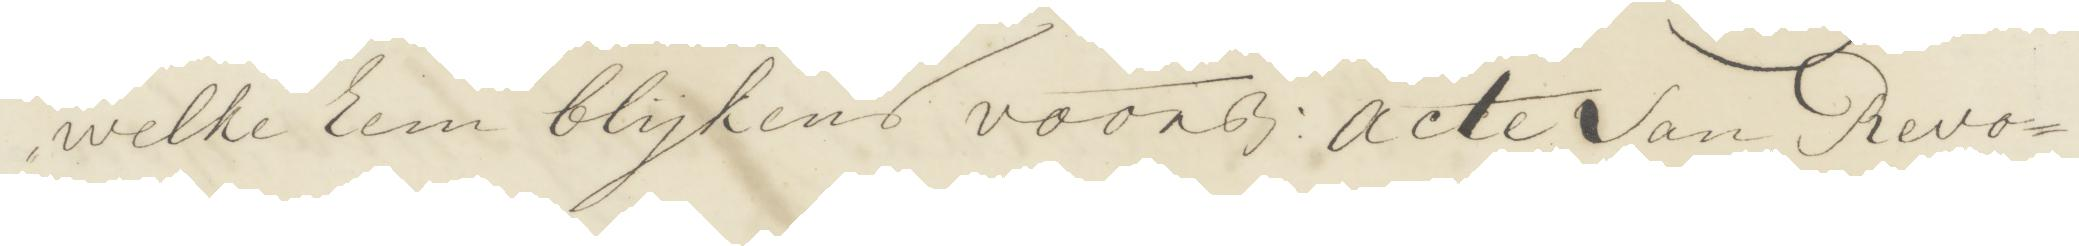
„welke hem blijkens voorsz: acte Van Revo=
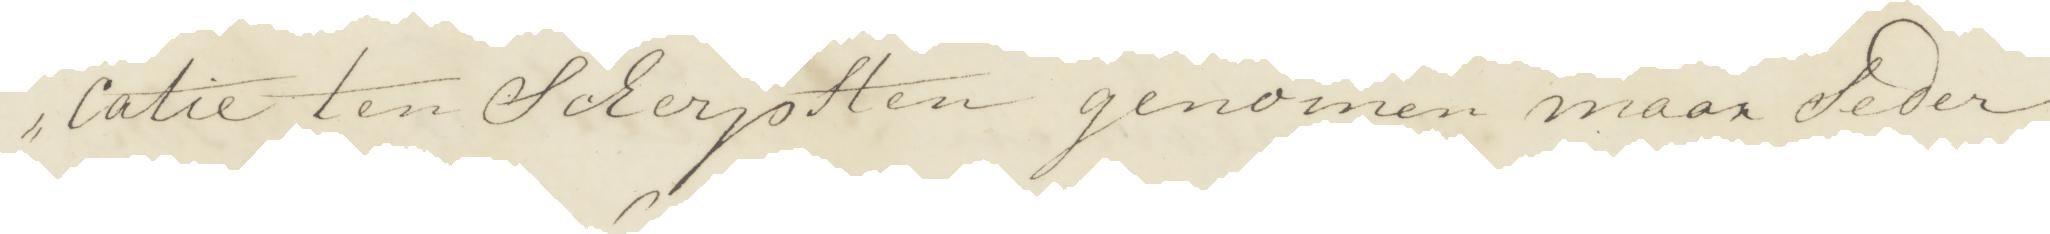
„catie ten Scherpsten genomen maar seder
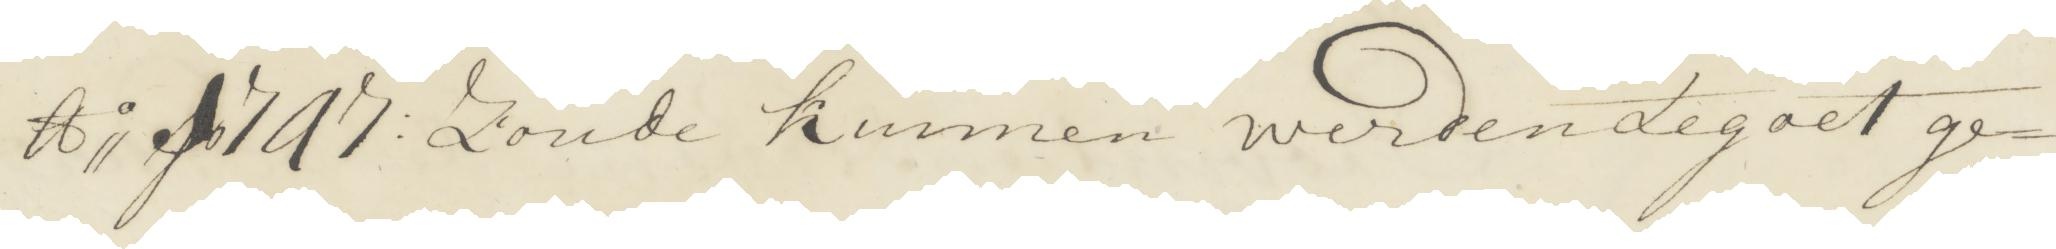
a„o 1747: Zoude kunnen werden tegoet ge=
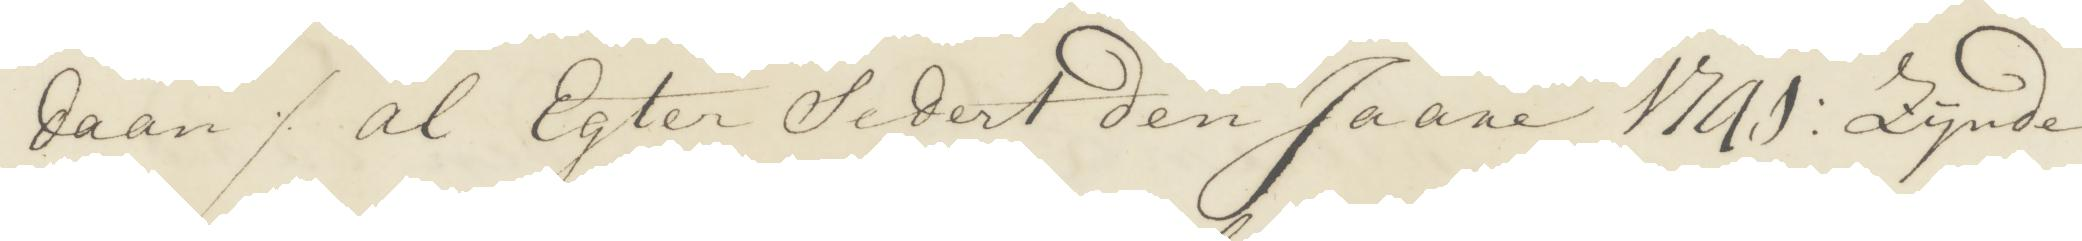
daan ./. al Egter sedert den Jaare 1741: Zijnde
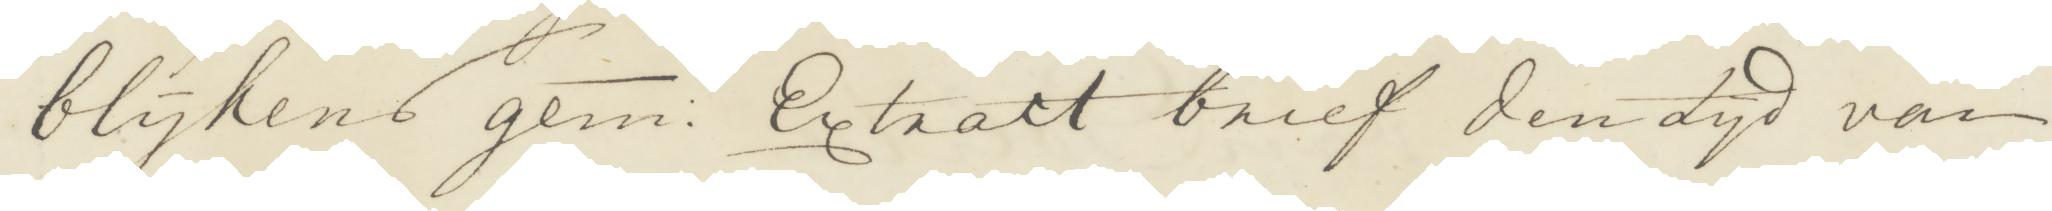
blijkens gem: Extract brief den tijd van
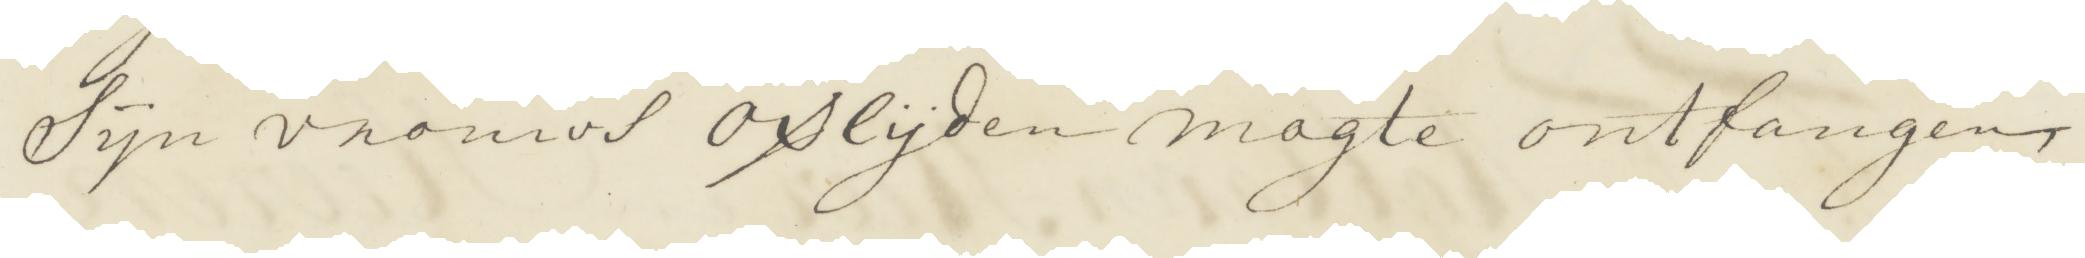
Sijn vrouws overlijden mogte ontfangen,
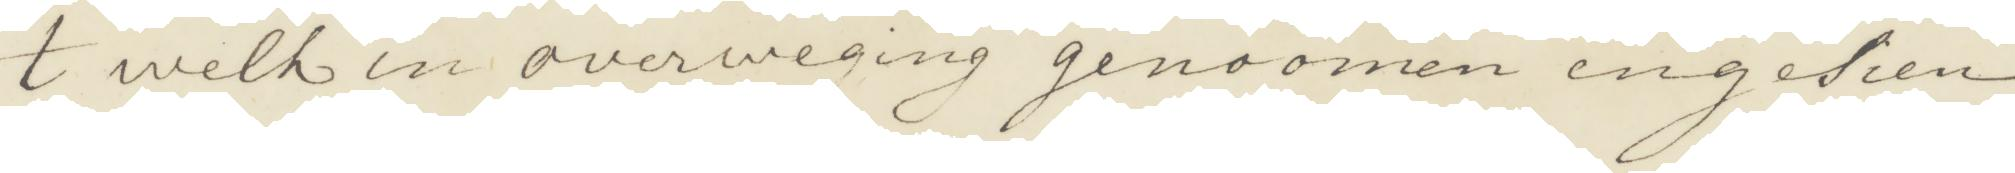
’t welk in overweging genoomen en gesien
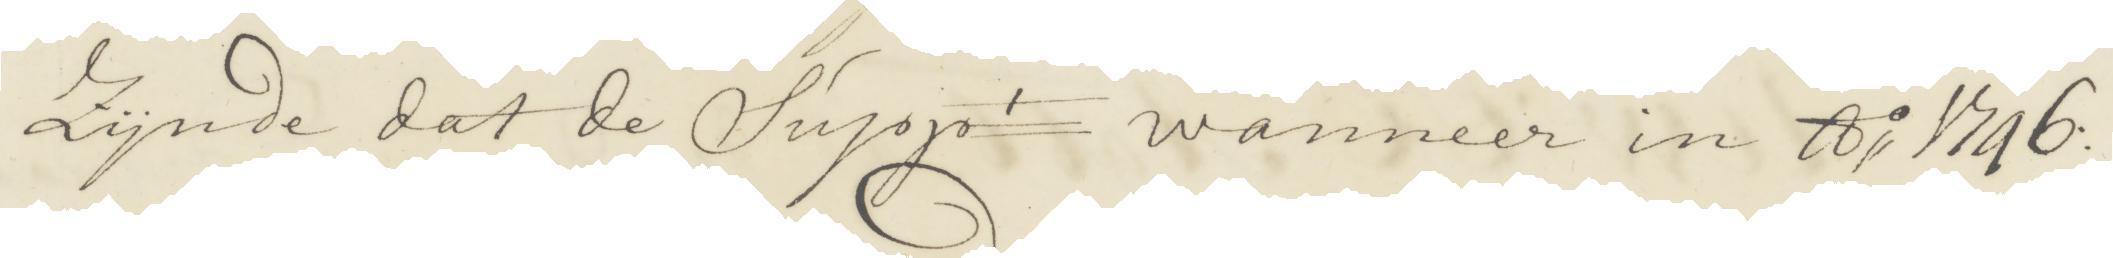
Zijnde dat de Supp=t wanneer in A„o 1746:
